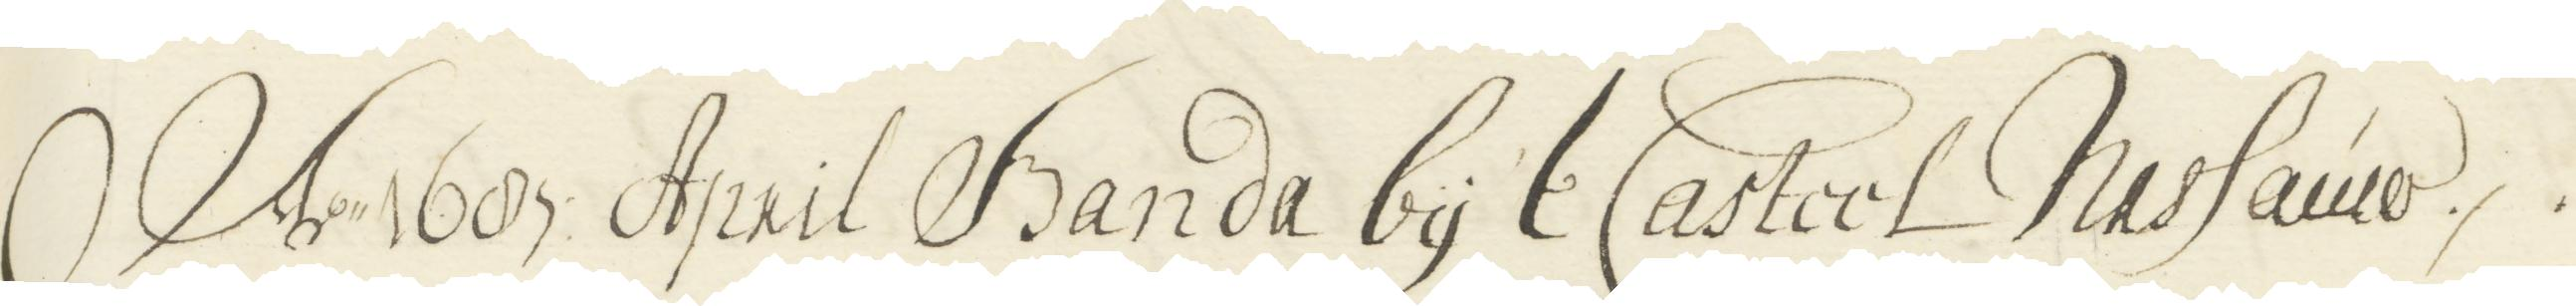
A„o 1687 April Banda bij ’t Casteel Nassauw./ .
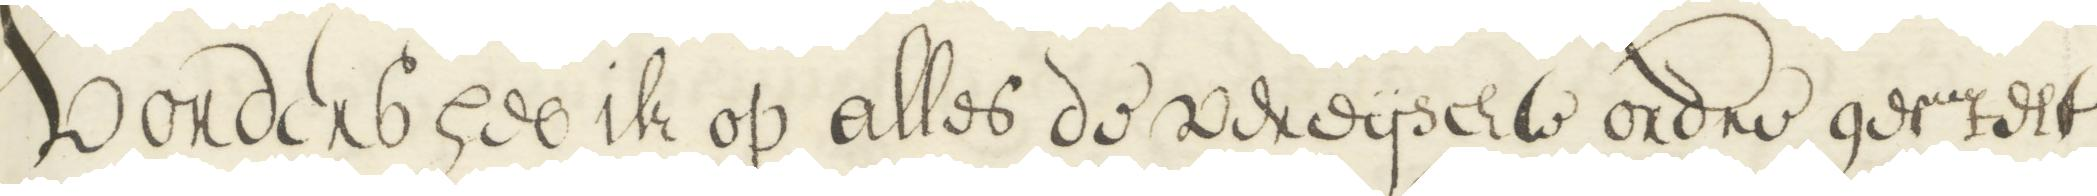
Vorders heb ik op alles de vereijschte ordre gestelt
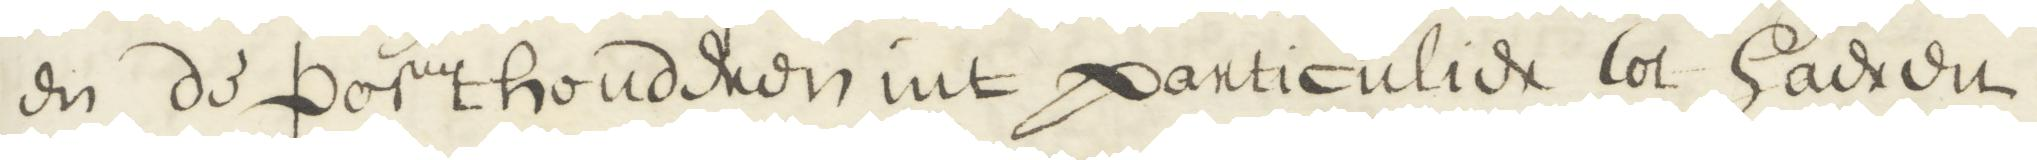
en de posthouderen int particulier tot haeren
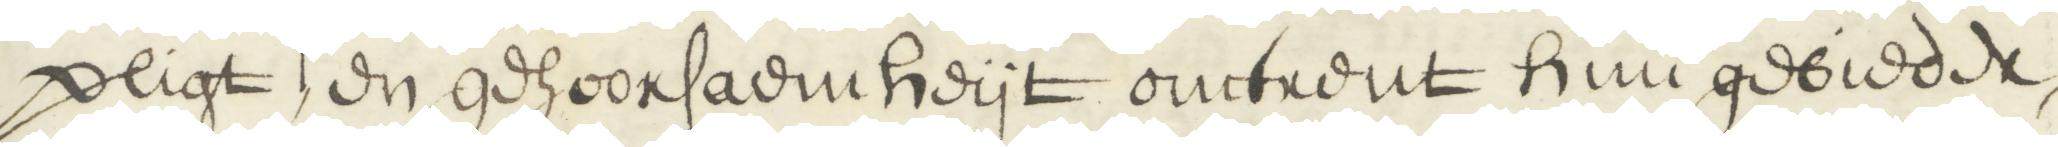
pligt, en gehoorsaemheijt omtrent hun gebieder
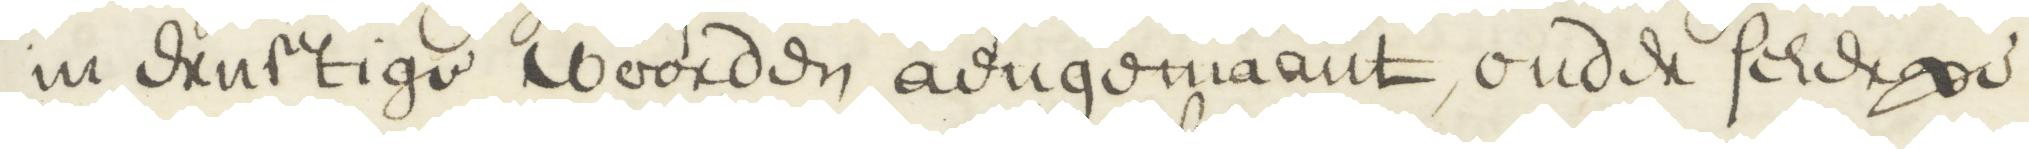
in ernstige woorden aengemaant, onder scherpe
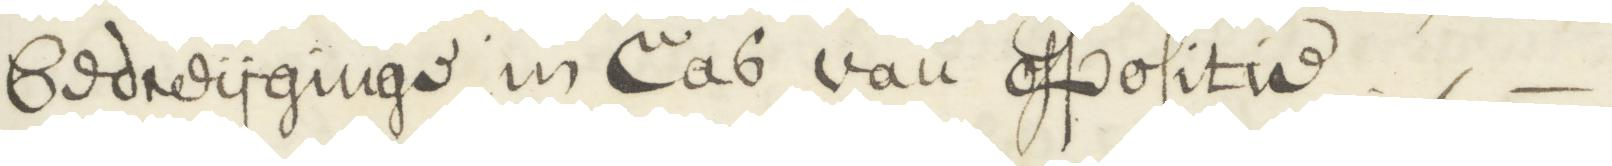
bedreijginge in Cas van oppositie. / —
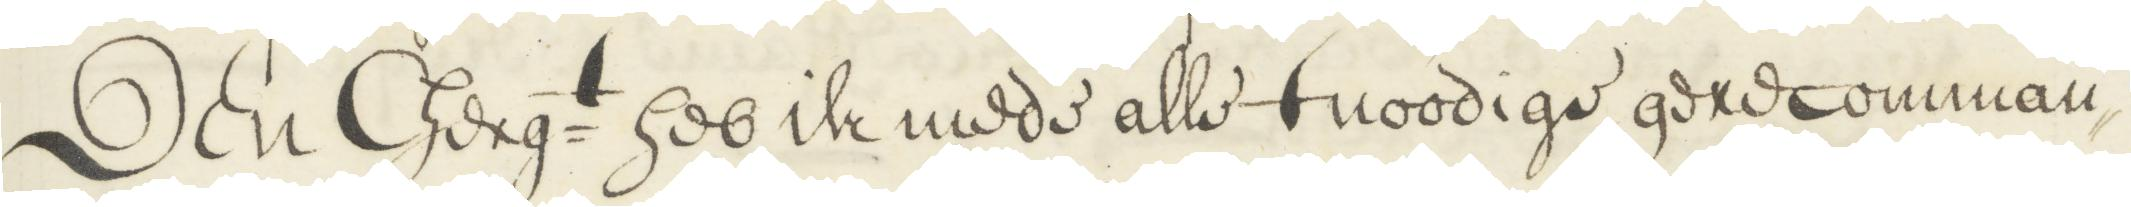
Den Cherg=t heb ik mede alle t noodige gerecomman„
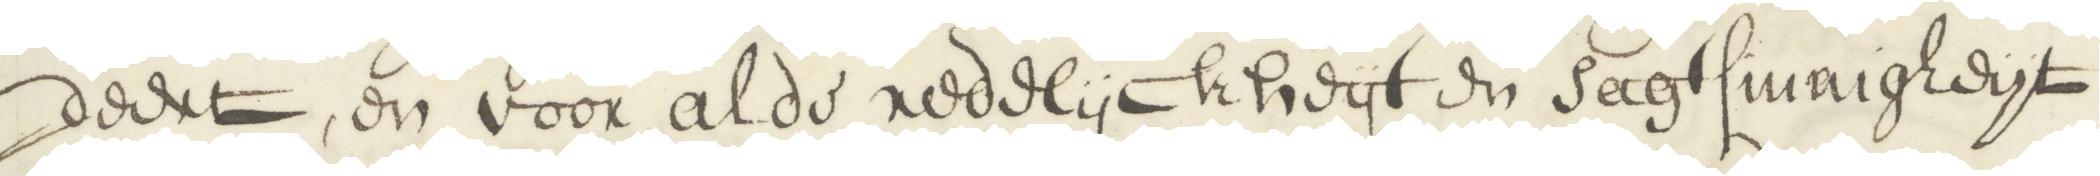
deert, en voor alde redelijckheijt en sagtsinnigheijt
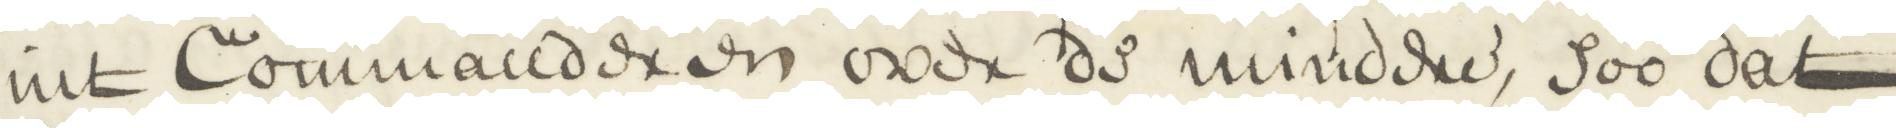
int Commanderen over de mindere, soo dat
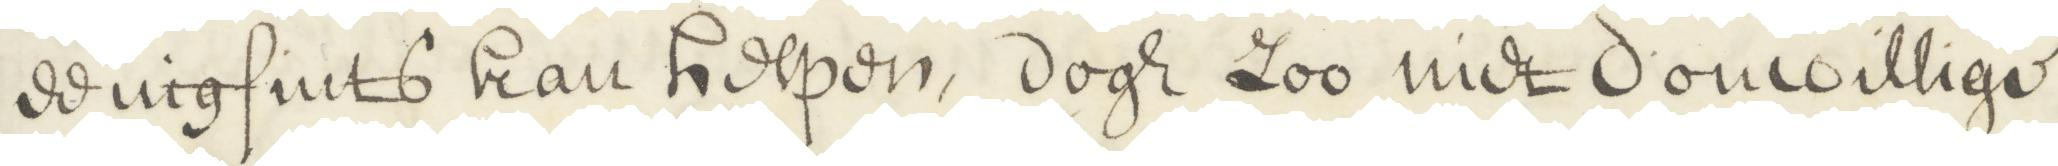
eenigsints kan helpen, dogh zoo niet d' onwillige
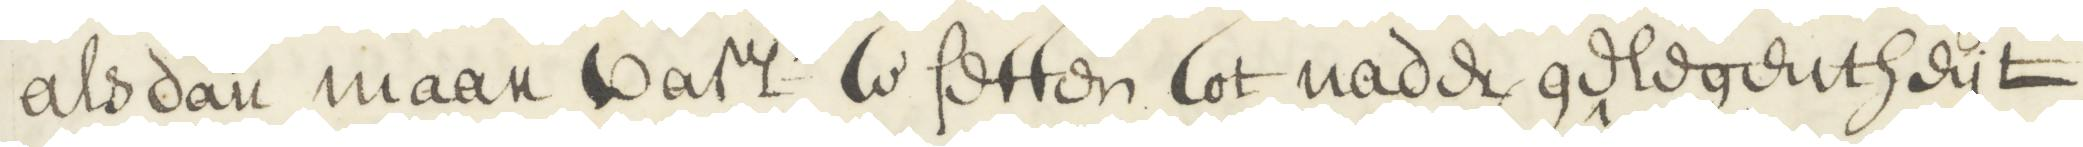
alsdan maar vast te setten tot nader gelegentheijt
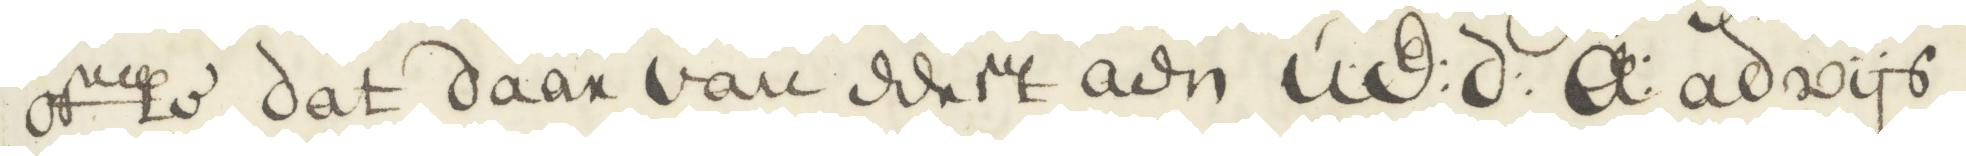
ofte dat daar van eerst aen uE: d: Â: advijs
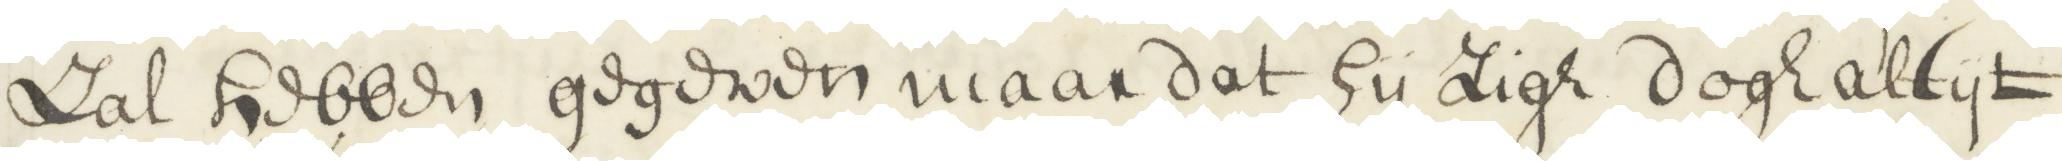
zal hebben gegeven maar dat hij zigh dogh altijt
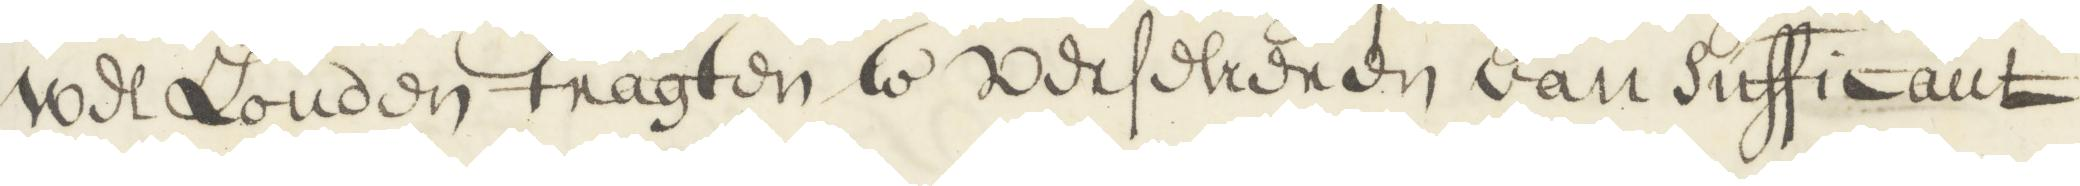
wel zouden tragten te versekeren van sufficant
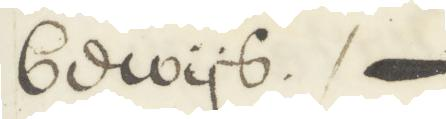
bewijs. /—
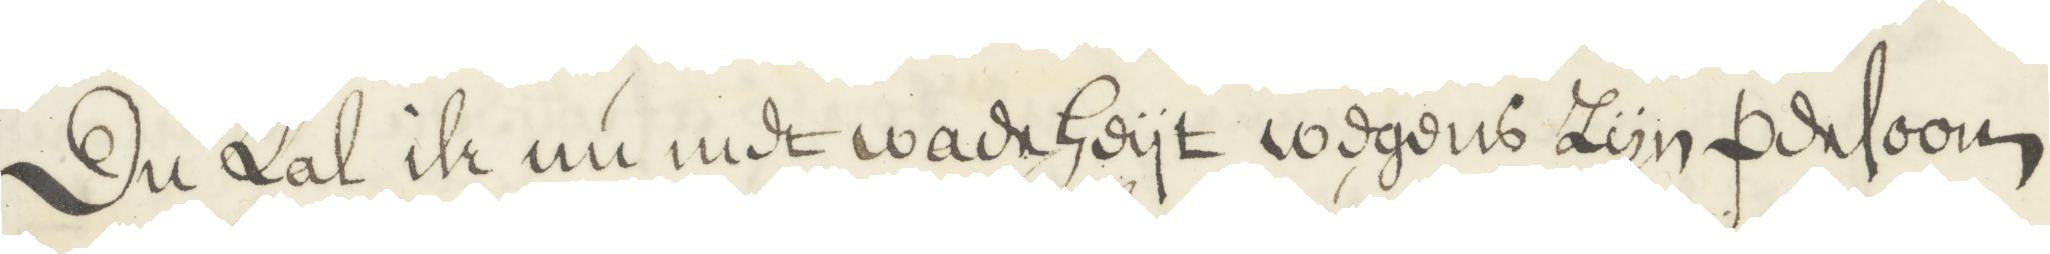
En zal ik nu met waerheijt wegens zijn persoon
